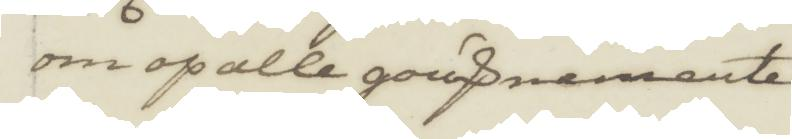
om op alle gouvernemente
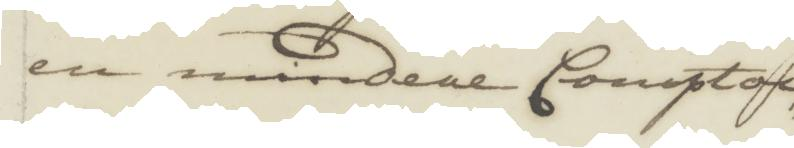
en mindere Comptoi„
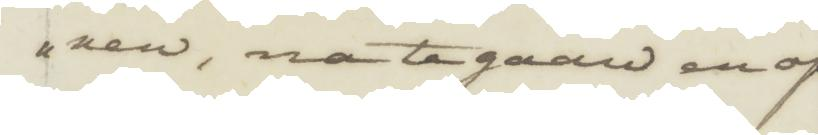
„ren, na te gaan en op
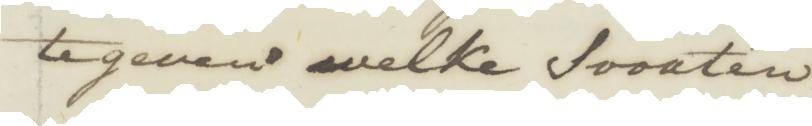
te geven welke soorten
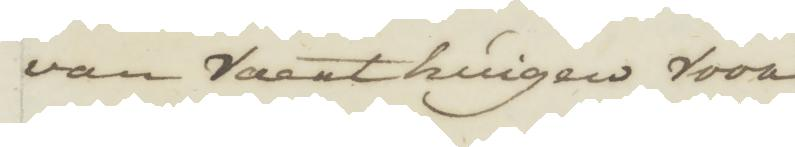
van vaerthuigen voor
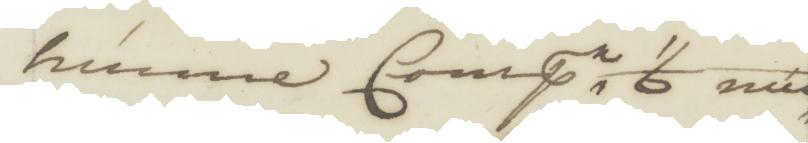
hunne Comp„r ’t nut
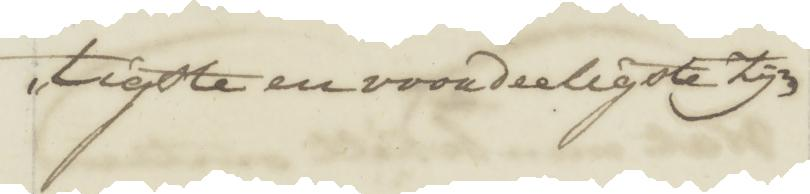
„tigste en voor deeligste zijn.
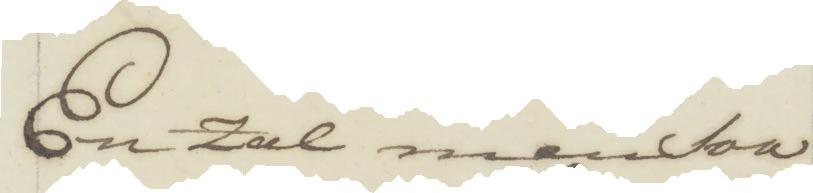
En zal men sor
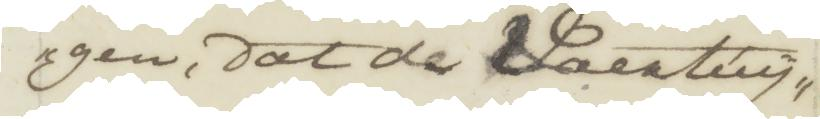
gen, dat de Vaertuij„
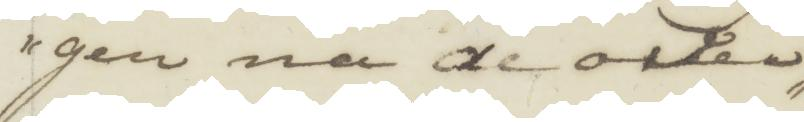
„gen na de over„
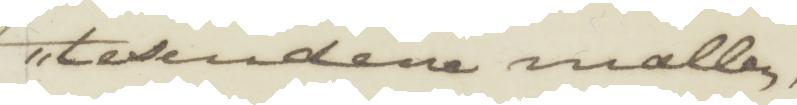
„tesendene mallen
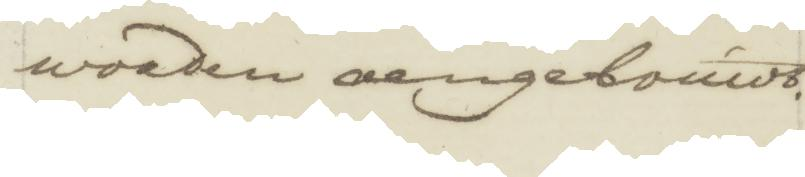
worden aengebouwt
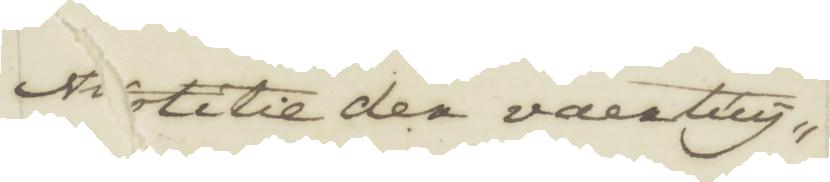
Notitie der vaertuij„
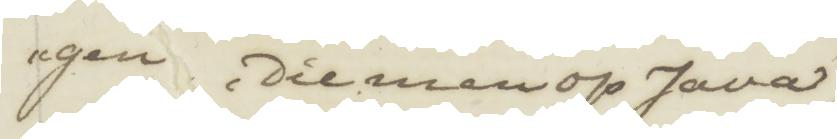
gen, die men op Java
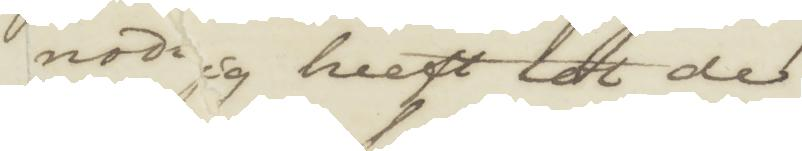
nodig heeft tot de
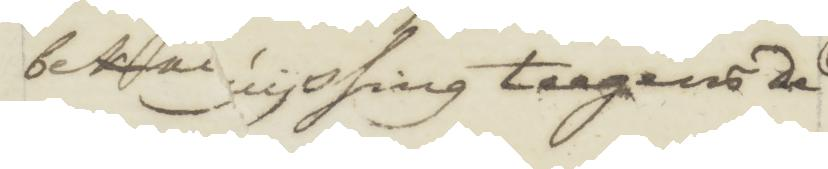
bekruijssing teegens de
